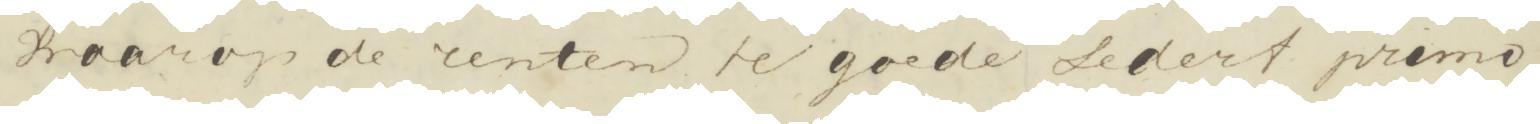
waarop de renten te goede sedert primo
